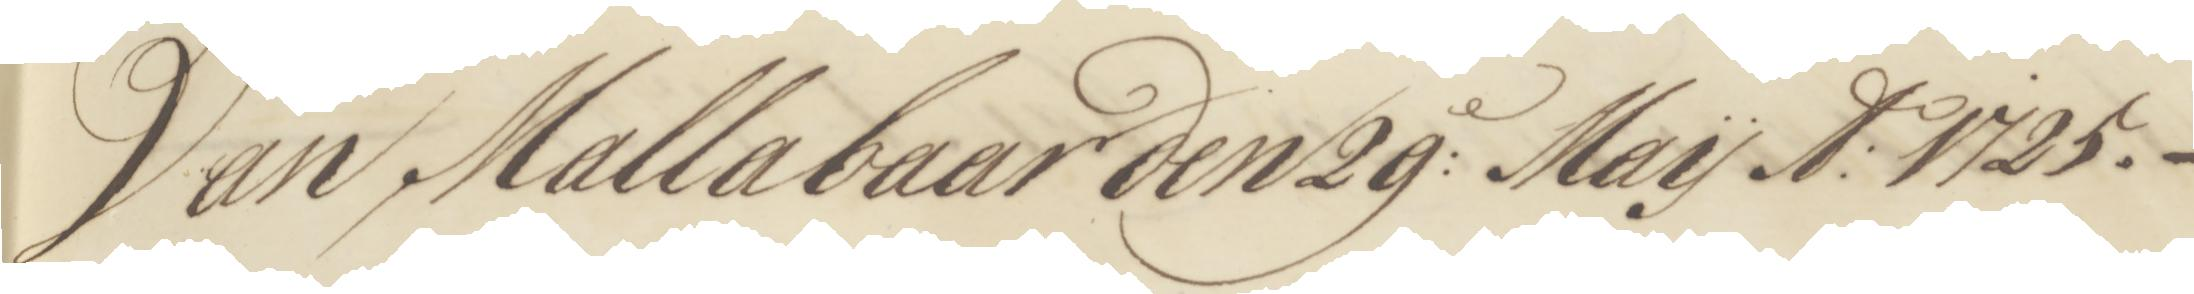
Van Mallabaar den 29:e Maij A:o 1725.
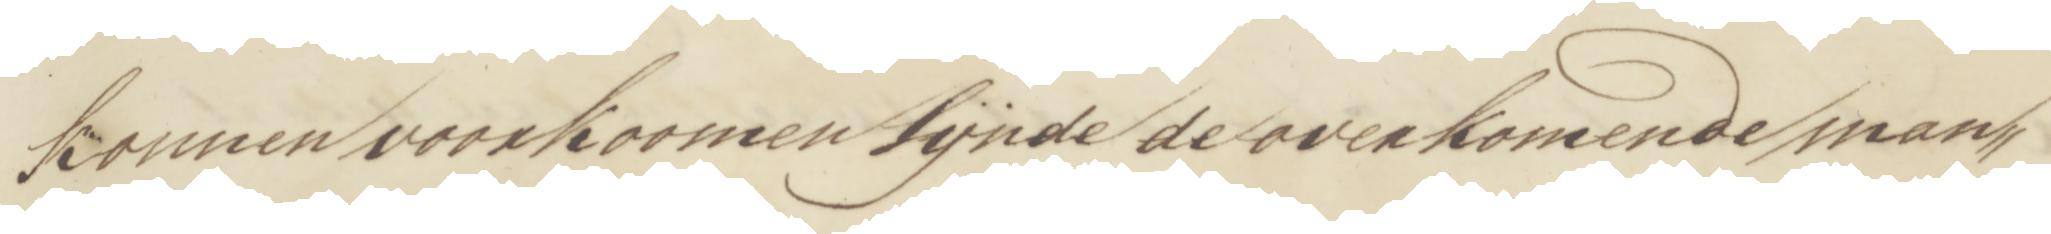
konnen voorkoomen sijnde de overkomende man„
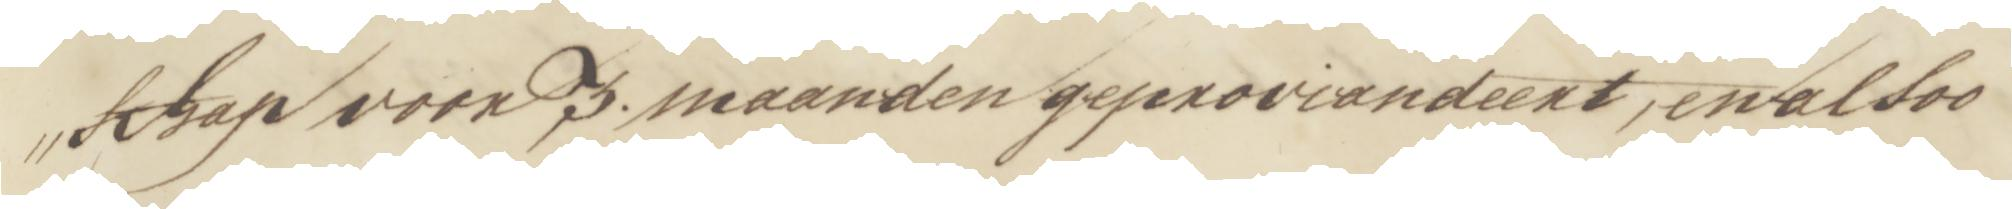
„schap voor 3. maanden geproviandeert, en alsoo
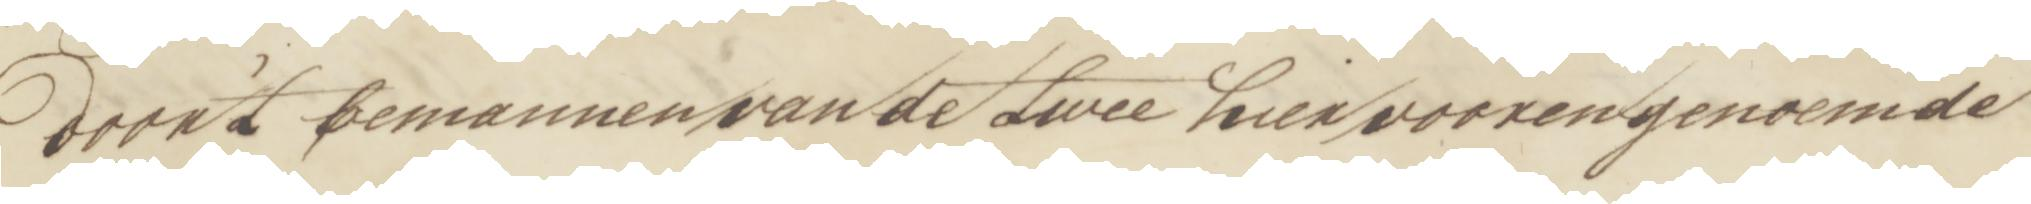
door’t bemannen van de twee hier vooren genoemde
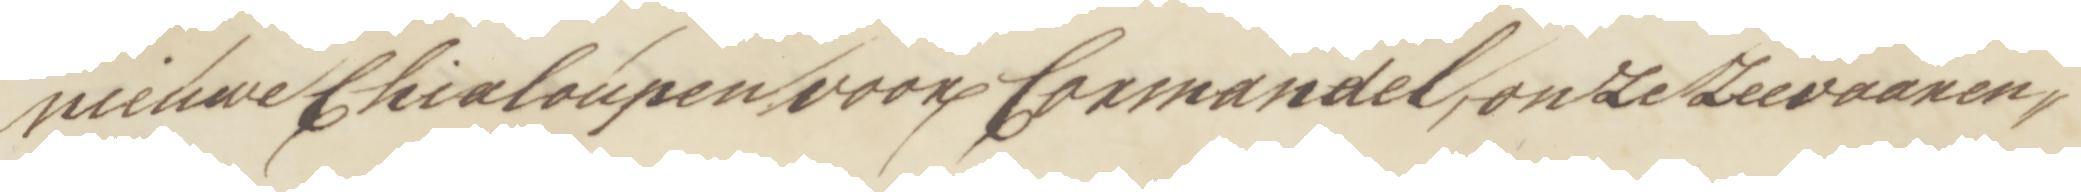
nieuwe Chialoupen voor Cormandel, onze zeevaaren„
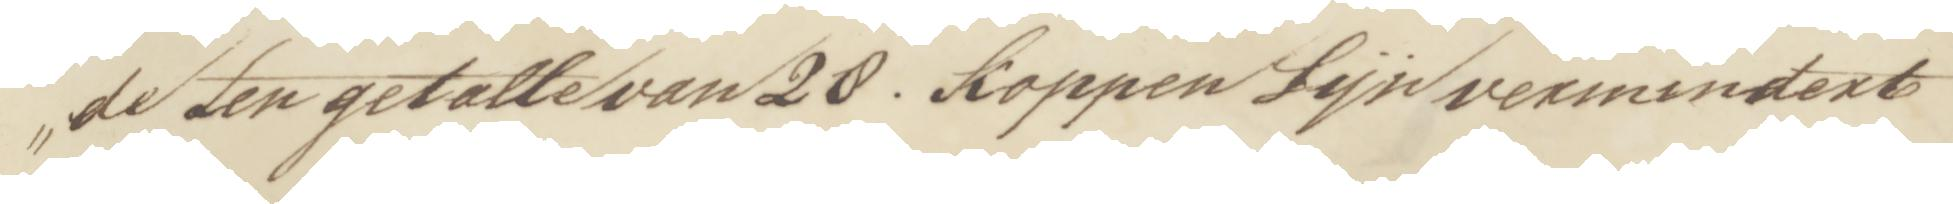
„de ten getalle van 28. koppen sijn vermindert
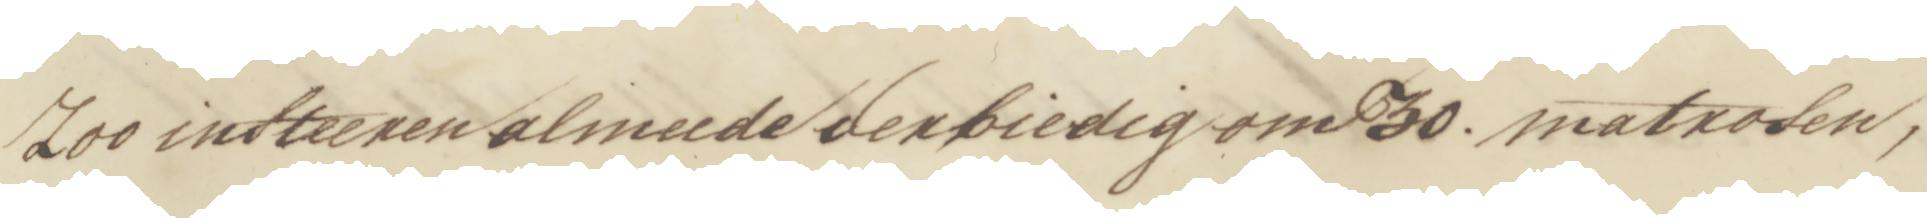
zoo insteeren almeede eerbiedig om 30. matrosen,
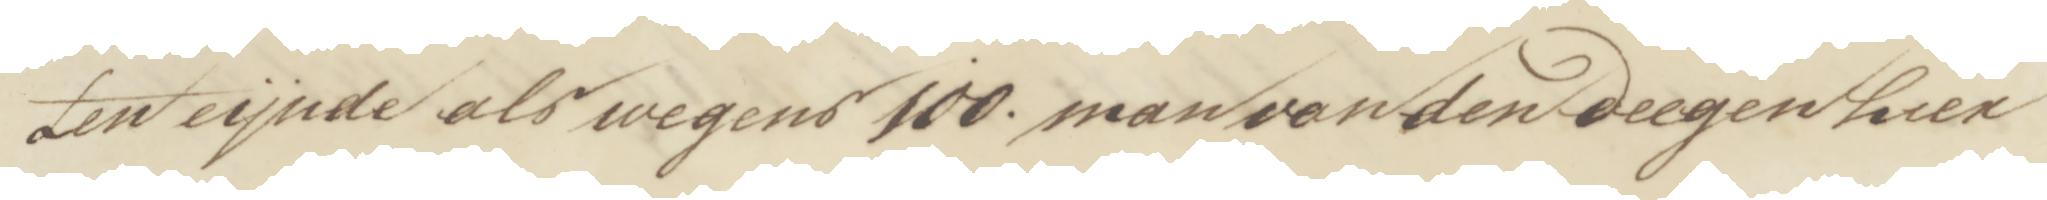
ten eijnde als wegens 100. man van den deegen hier
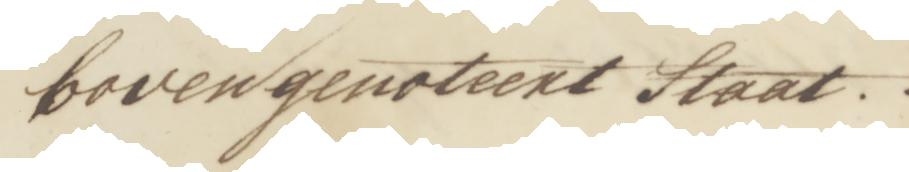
boven genoteert staat.
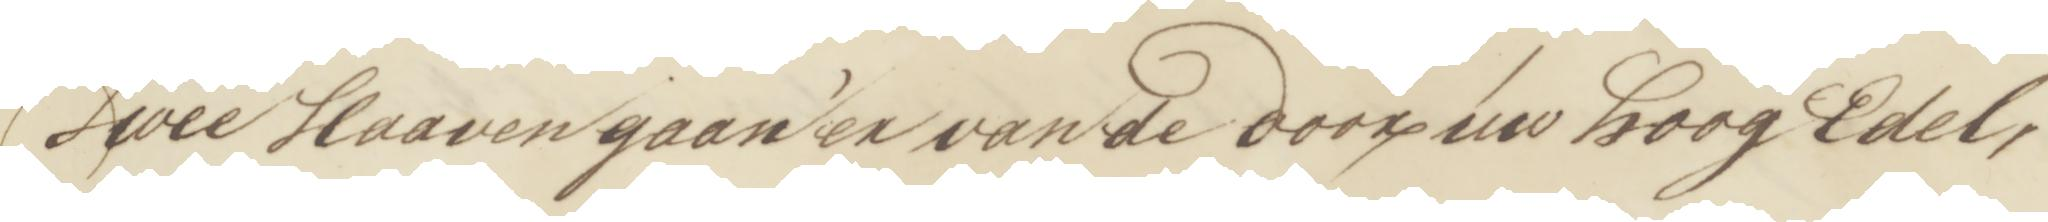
Twee slaaven gaan 'er van de door uw hoog Edel,
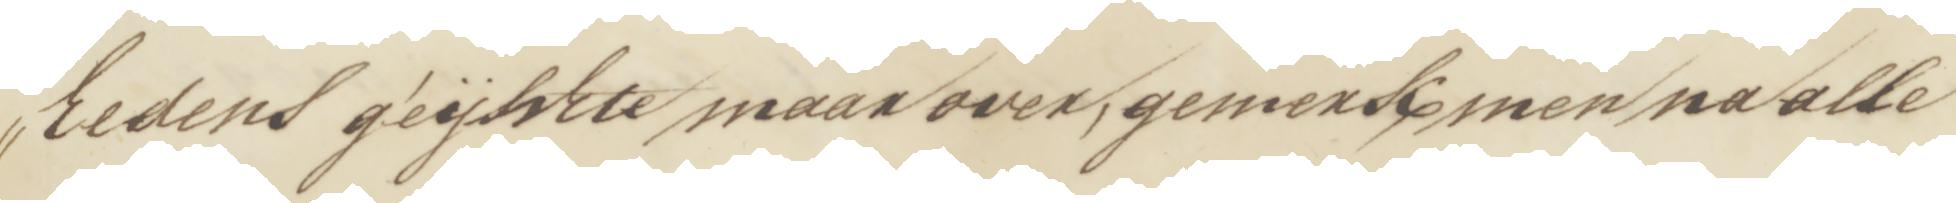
„hedens g'eijschte maar over, gemerk men na alle
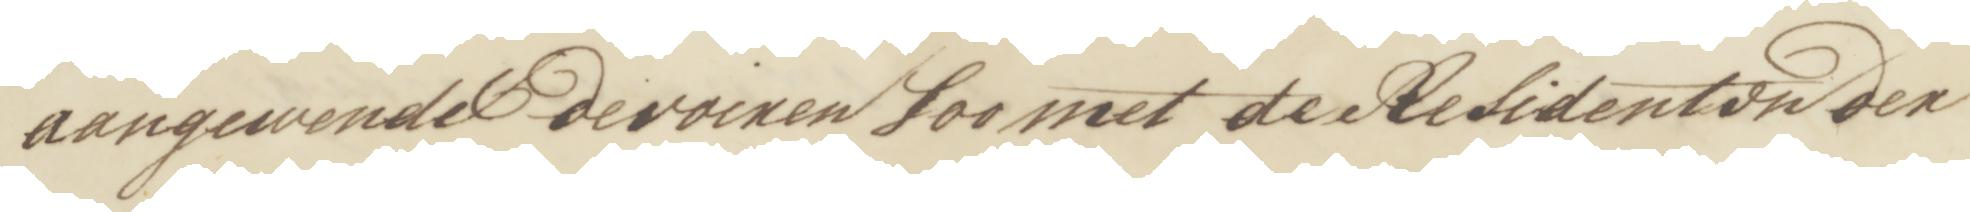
aangewende devoiren soo met de Residenten der
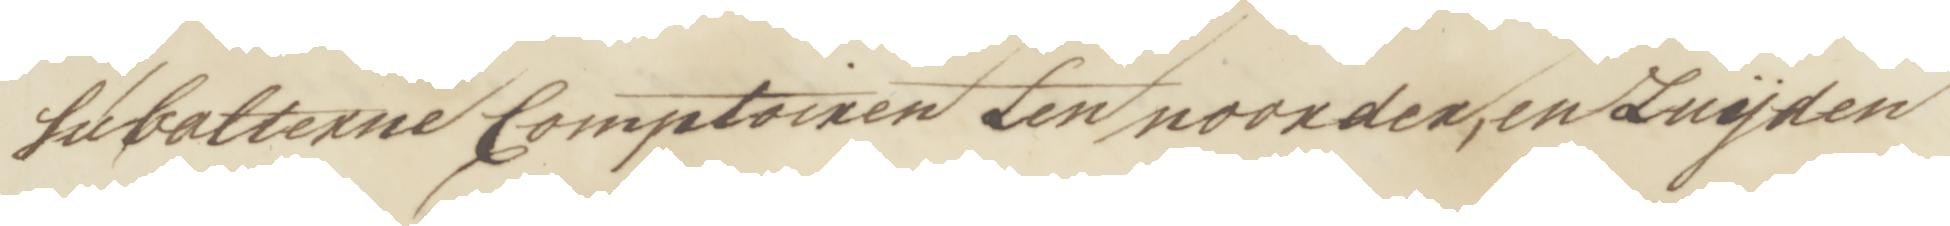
subalterne Comptoiren ten noorder, en zuijden
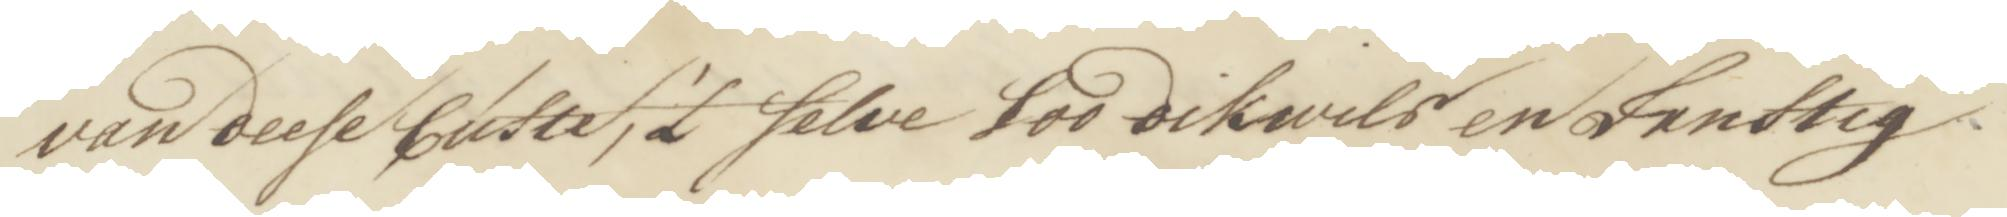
van deese Custe, 't selve soo dikwils en Ernstig
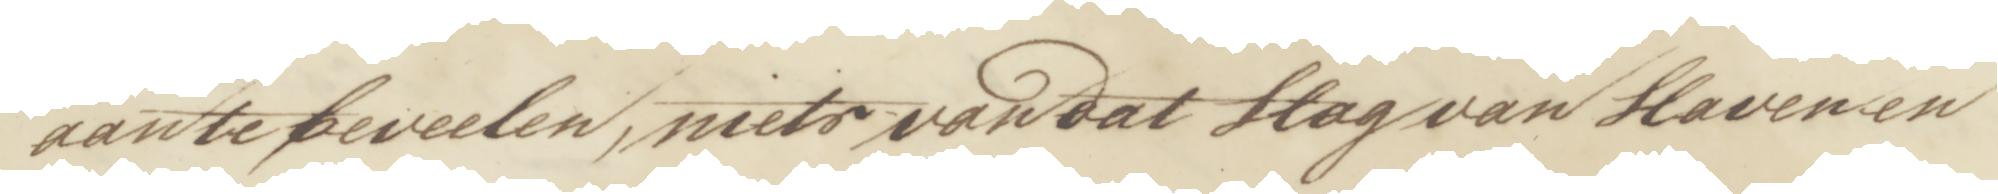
aan te beveelen, niets van dat slag van slaven en
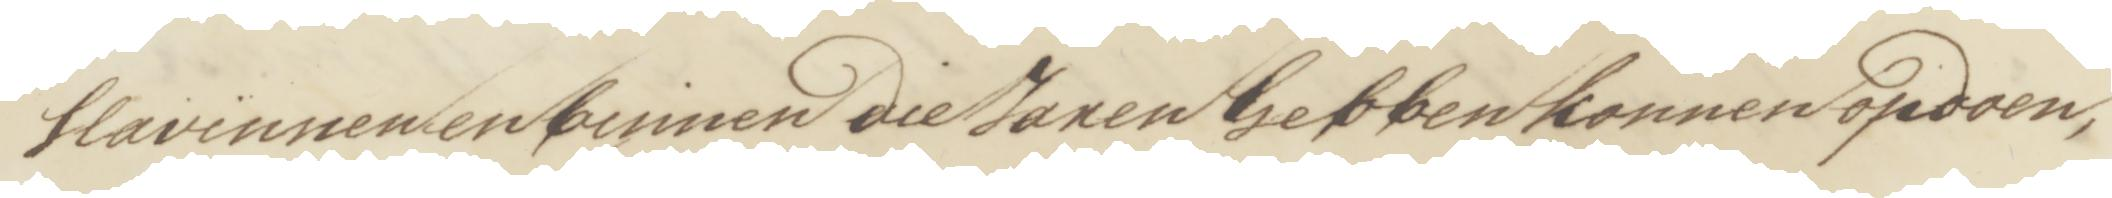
slavinnen en binnen die Iaren hebben konnen opdoen,
